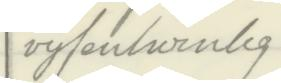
vyf entwintig
